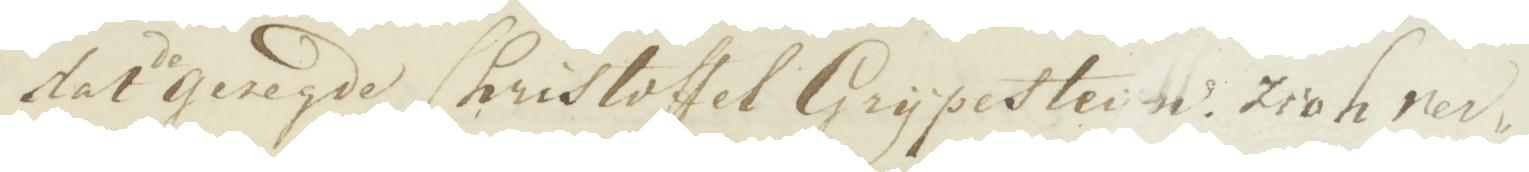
dat de gezegde Christoffel Grijpestein. zich ver„
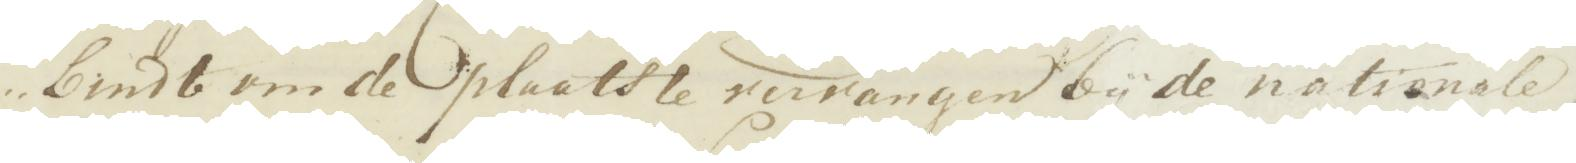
„bindt om de plaats te vervangen bij de nationale
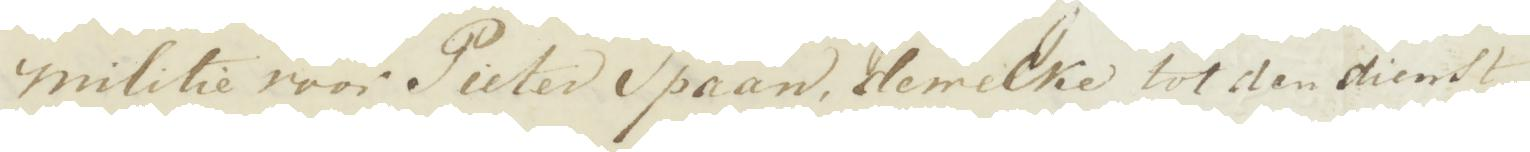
militie voor Pieter Spaan, dewelke tot den dienst
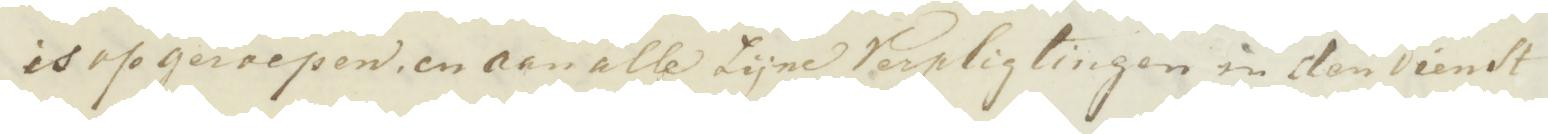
is op geroepen, en aan alle zijne Verpligtingen in den dienst
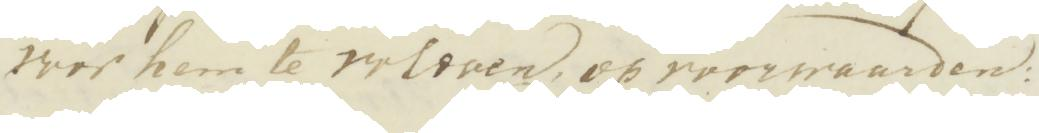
voor hem te voldoen, op voorwaarden:
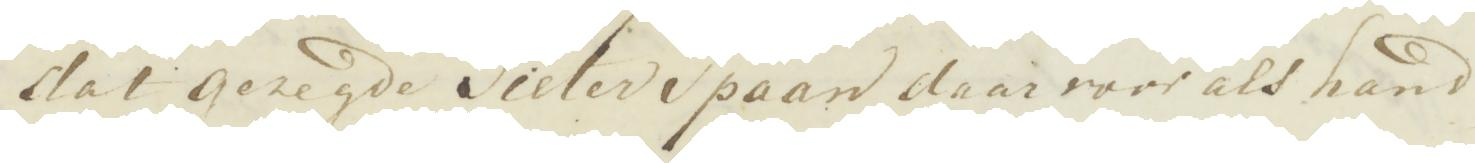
dat gezegde Pieter Spaan daar voor als hand
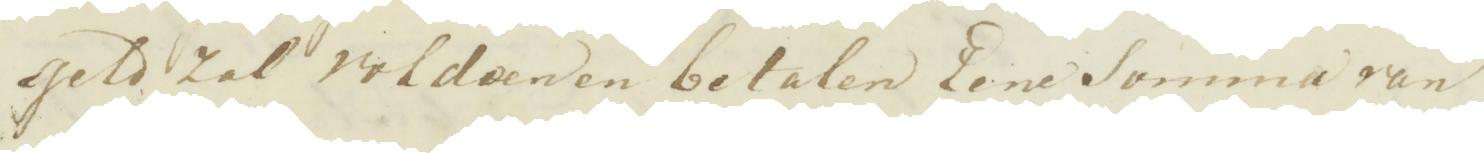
geld zal voldoen en betalen Eene somma van
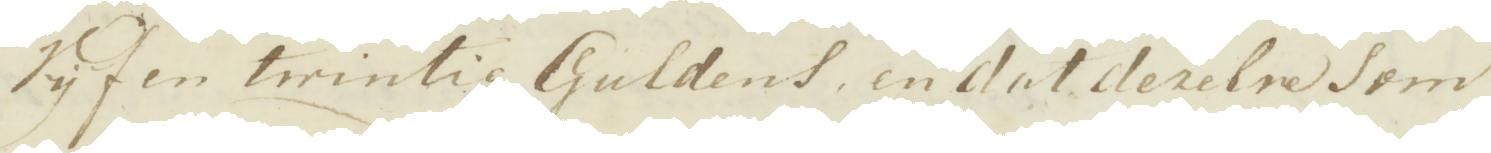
Vijf en twintig Guldens, en dat dezelve som
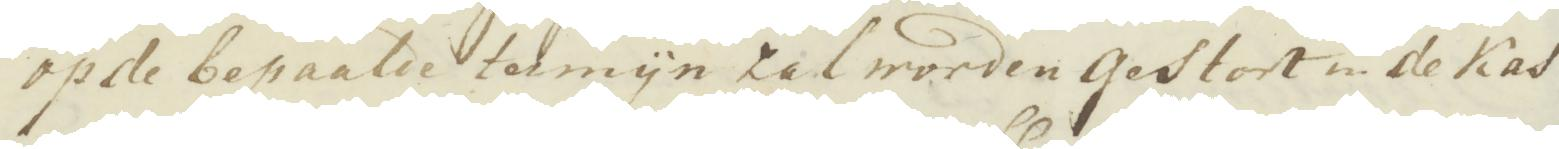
op de bepaalde termijn zal worden gestort in de kas
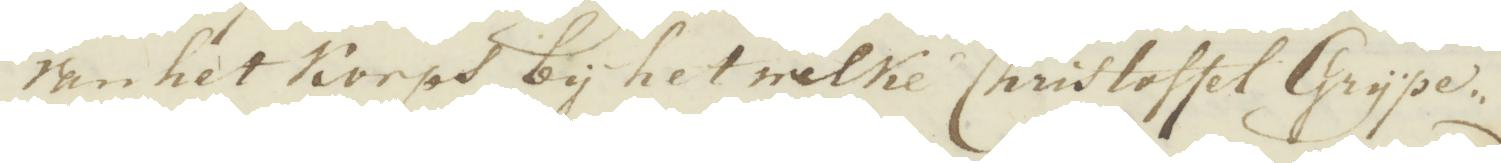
van het korps bij het welke Christoffel Grijpe„
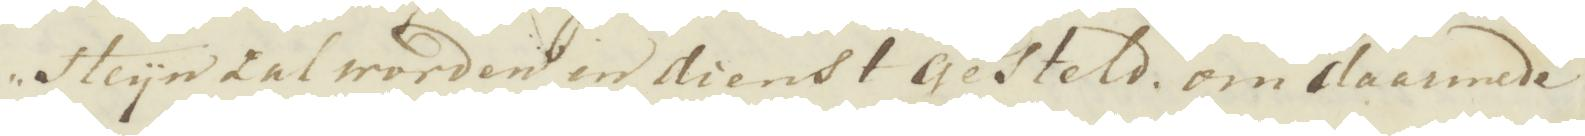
„steijn zal worden in dienst gesteld, om daarmede
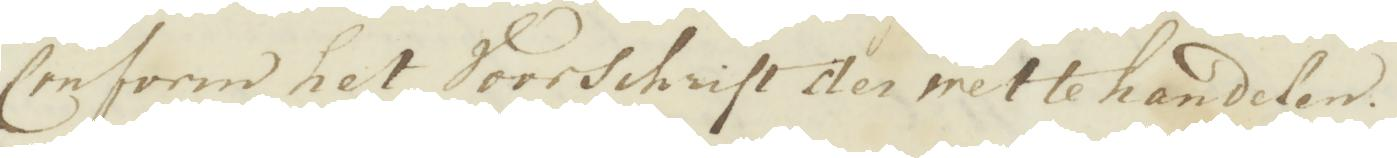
conform het Voorschrift der wet te handelen.
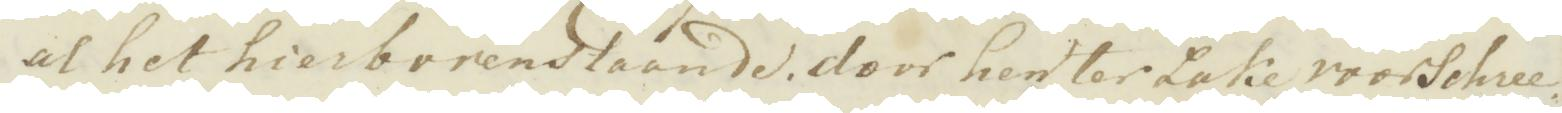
al het hier bovenstaande, door hen ter zake voorschree„
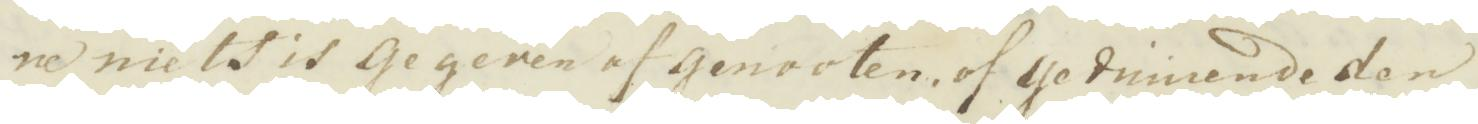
ve niets is gegeven of genooten, of geduurende den
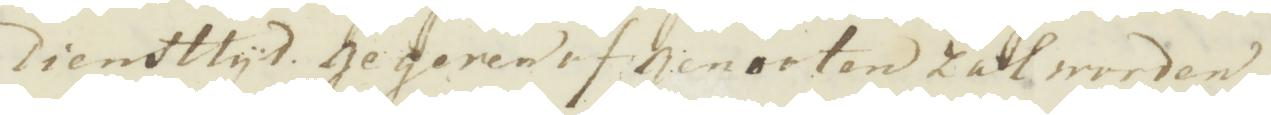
diensttijd gegeven of genooten zal worden.
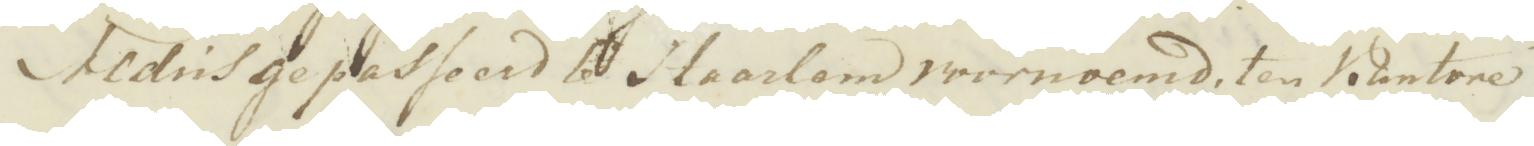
Aldus gepasseerd te Haarlem voornoemd, ten Kantore
